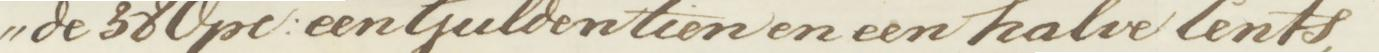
„de 38Opc: een Gulden tien en een halve Cents,
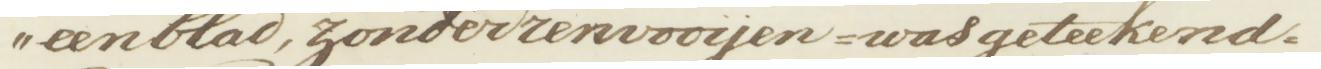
„een blad, zonder renvooijen =was geteekend=
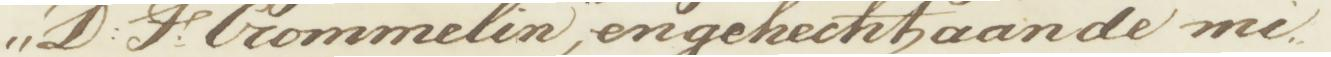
„D: F: Crommelin, "engehecht aan de mi„
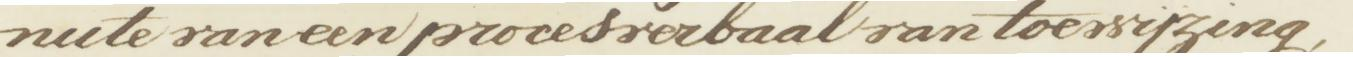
nute van een procesverbaal van toewijzing,
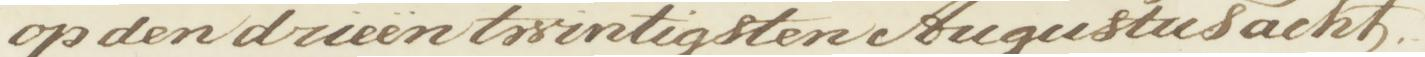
op den drieëntwintigsten Augustus acht„
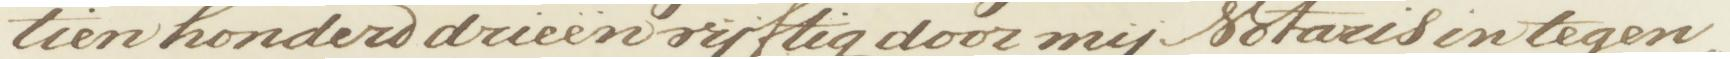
tien honderd drieën vijftig door mij Notaris in tegen„
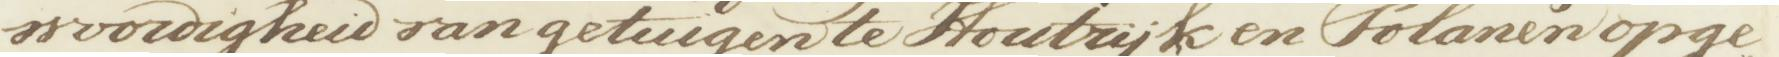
woordigheid van getuigen te Houtrijk en Polanen opge„
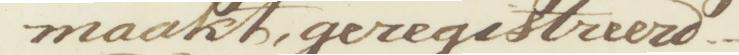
maakt, geregistreerd.-
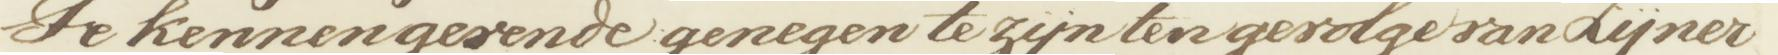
Te kennen gevende genegen te zijn ten gevolge van Zijner
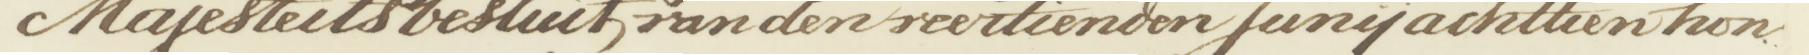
Majesteits besluit, van den veertienden Junij achttien hon„
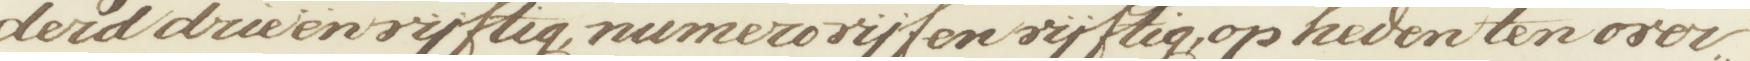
derd drie ën vijftig, numero vijf en vijftig, op heden ten over„
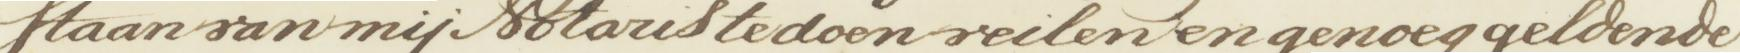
staan van mij Notaris te doen veilen en genoeg geldende
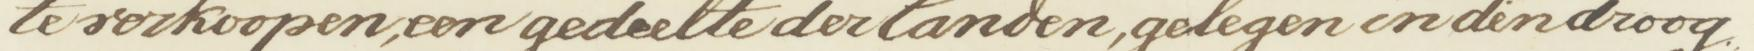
te verkoopen, een gedeelte der landen, gelegen in den droog„
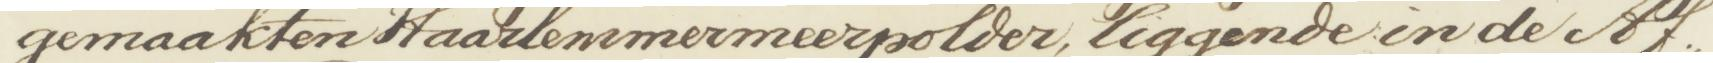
gemaakten Haarlemmermeerpolder, liggende in de Af„
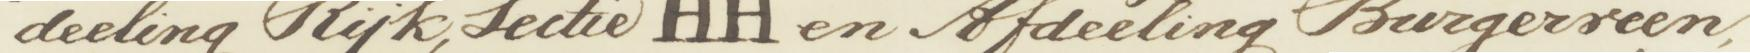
deeling Rijk, Sectie HH en Afdeeling Burgerveen
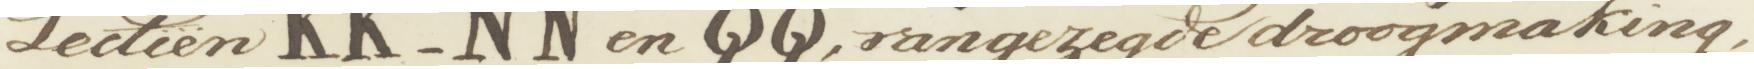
Sectien KK-NN en QQ, vangezegde droogmaking,
